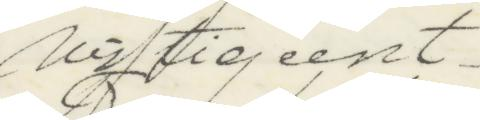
vijftig cent
